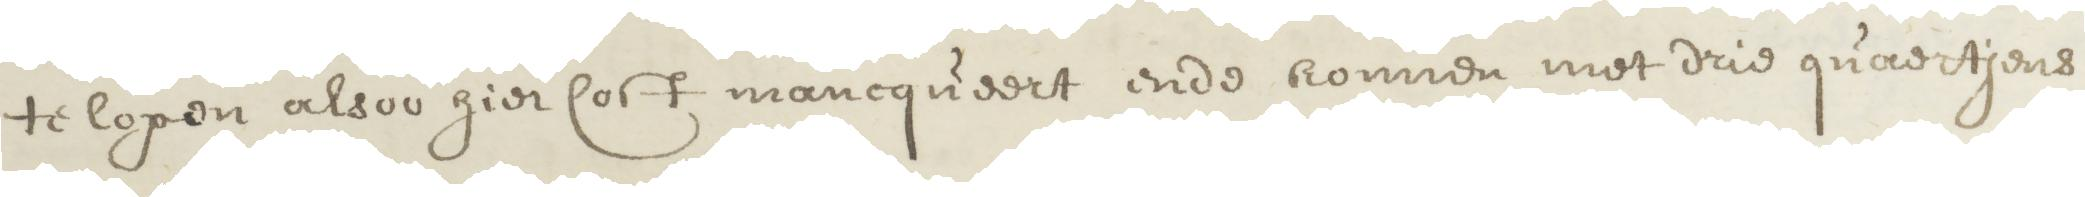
te lopen alsoo hier cost mantqueert ende konnen met drie quaertjens
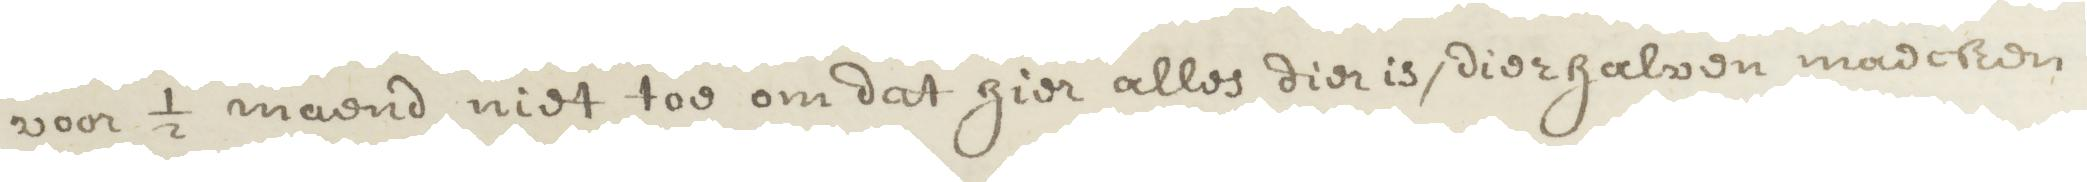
voor ½ maend niet toe om dat hier alles dier is, dierhalven maecken
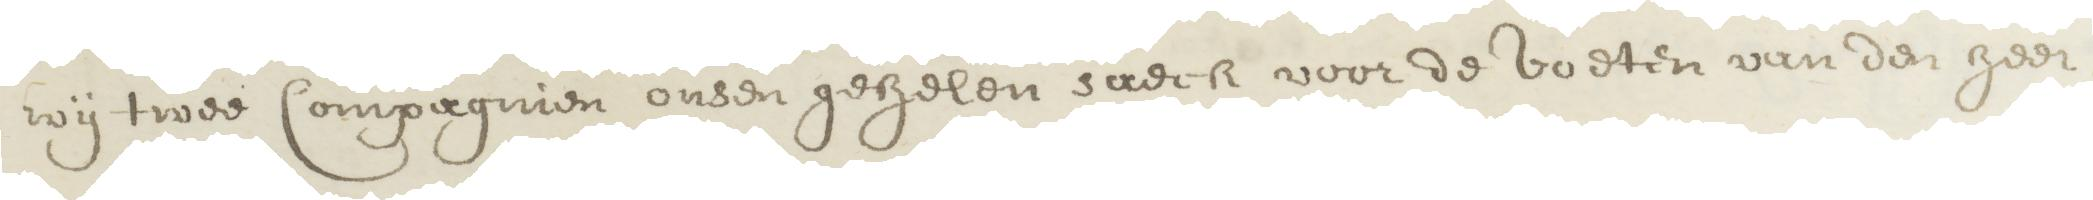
wij twee compagnien onsen gehelen saeck voor de voeten van den heer
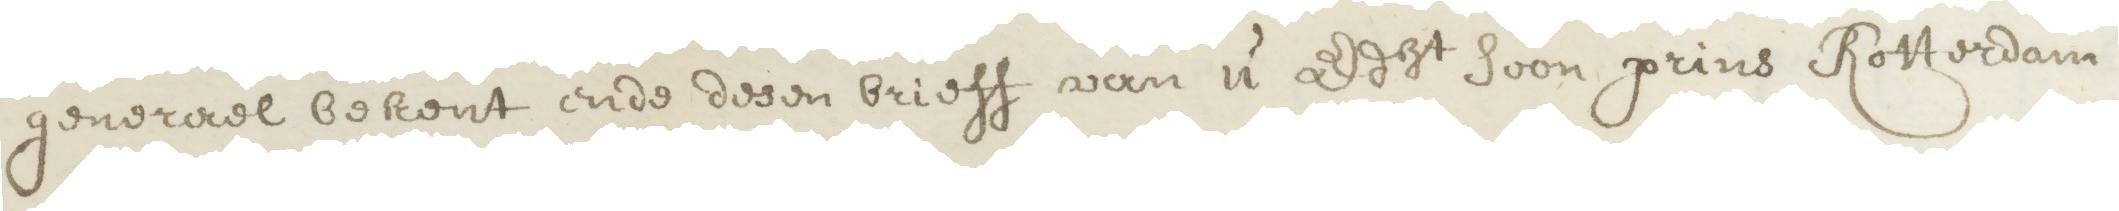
generael bekont ende desen brieff van u Edht Soon prins Rotterdam
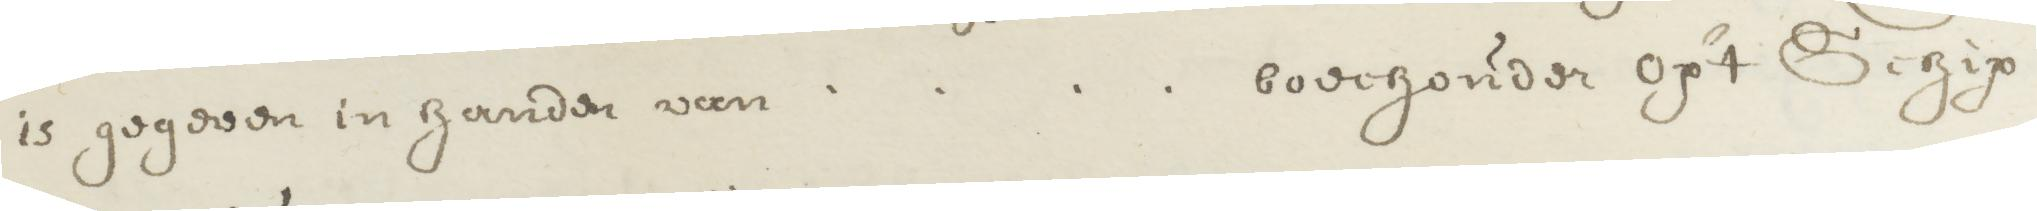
is gegeven in handen van . . . . boechouder op’t Schip
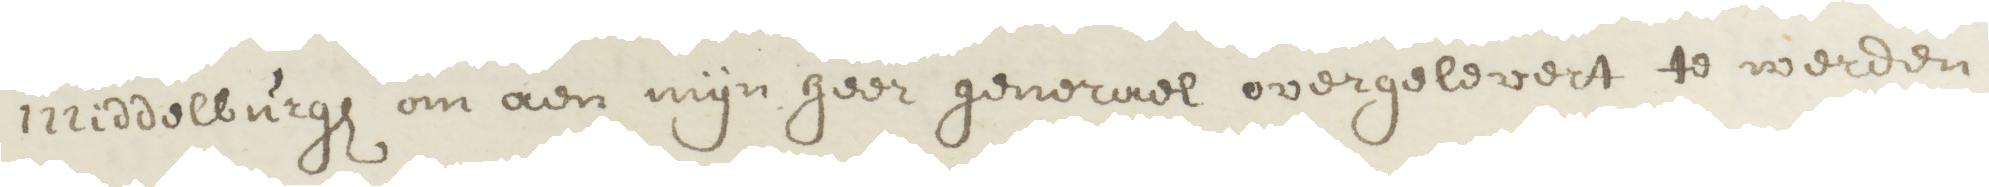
middelburgh om aen mijn heer generael overgelevert te werden
